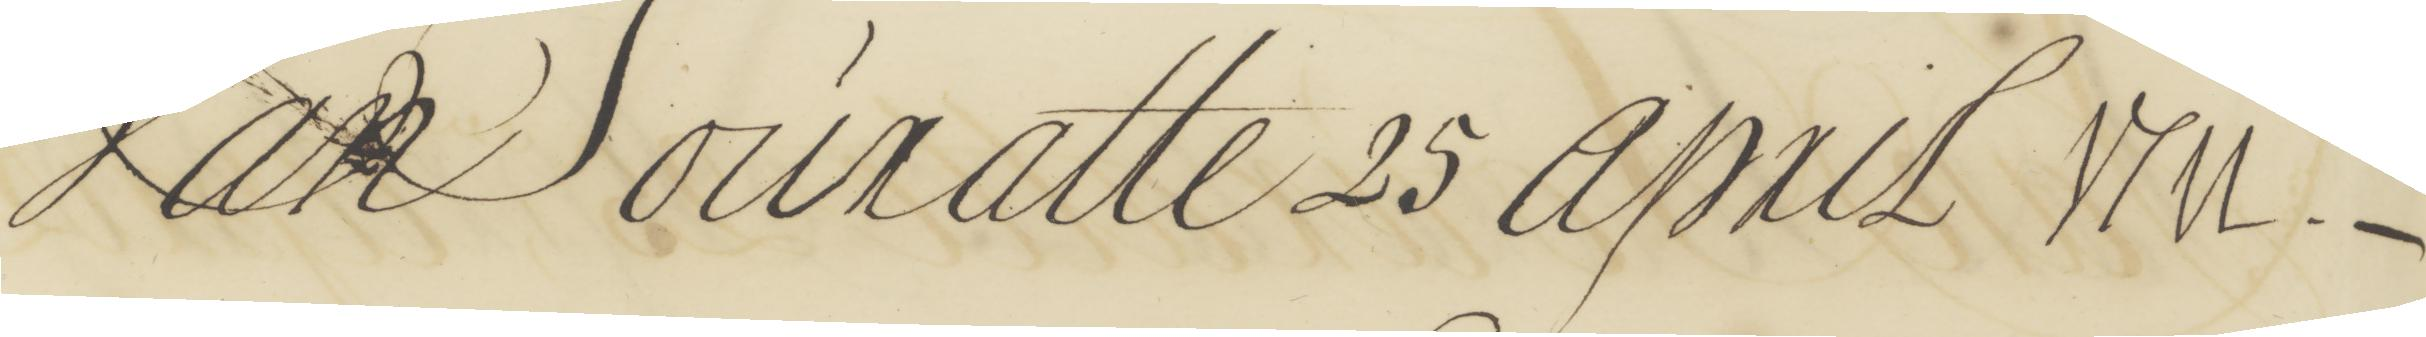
Van Souratte 25 april 1711. —
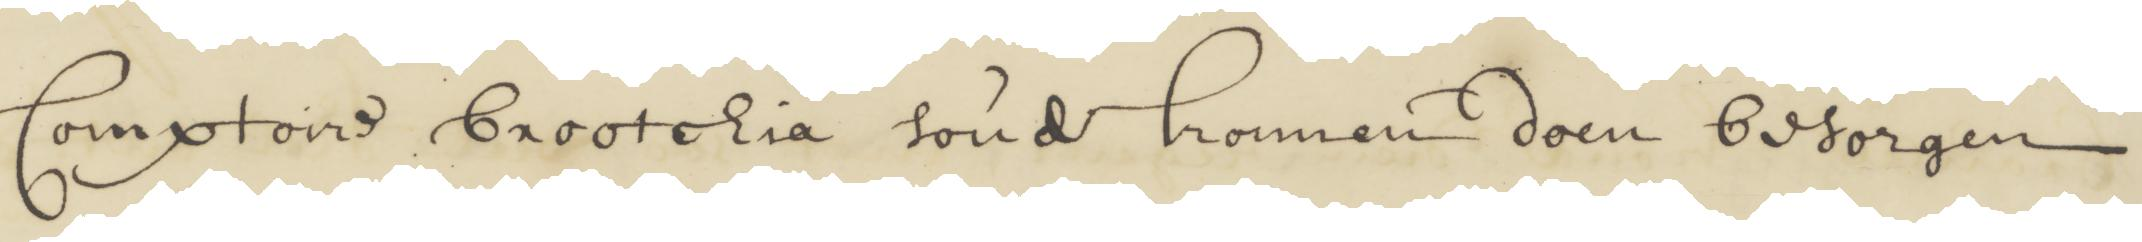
Comptoire brootchia soude konnen doen besorgen
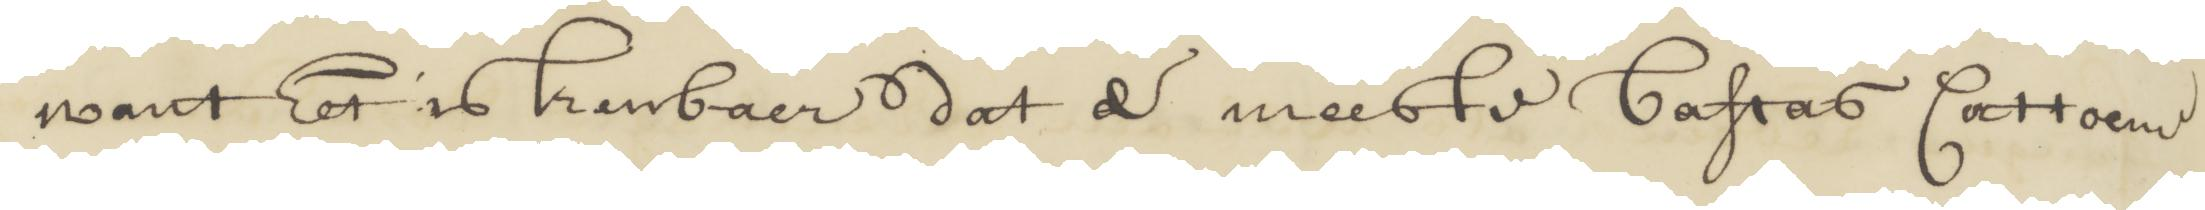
want het is kenbaer dat de meeste bastas Cattoene
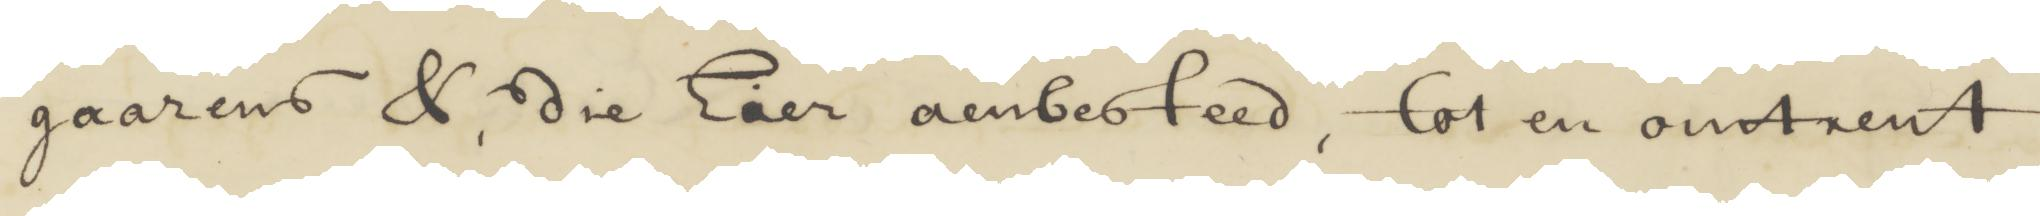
gaarens &, die hier aenbesteed, tot en omtrent
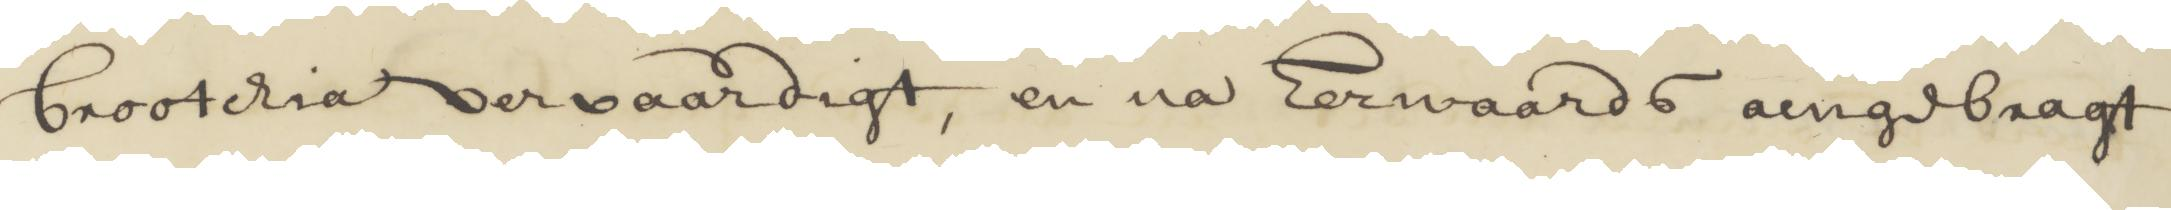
brootchia vervaardigt, en na herwaards aengebragt
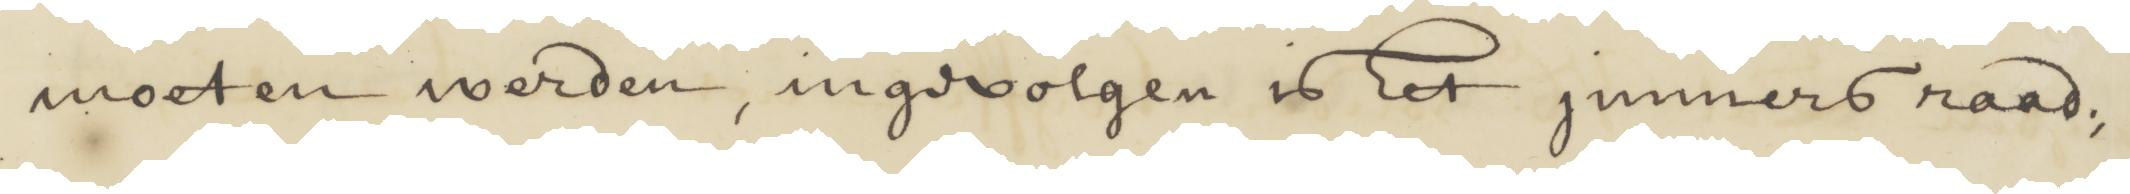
moeten werden, ingevolgen is het jmmers raad„
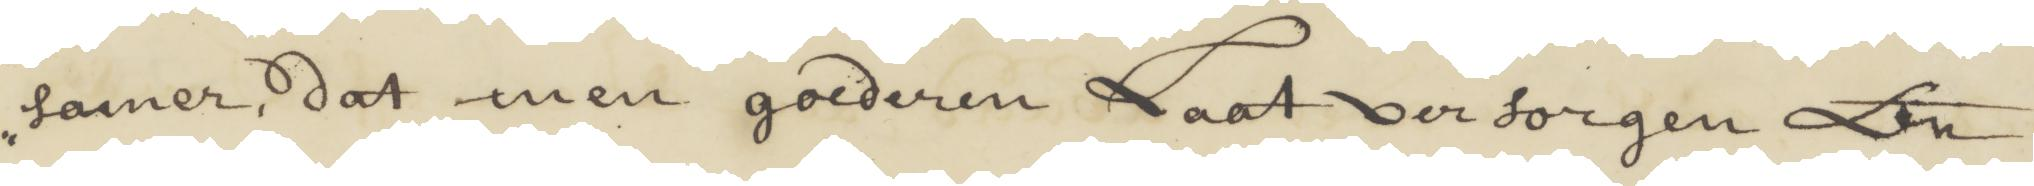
„samer, dat men goederen Laat versorgen ten
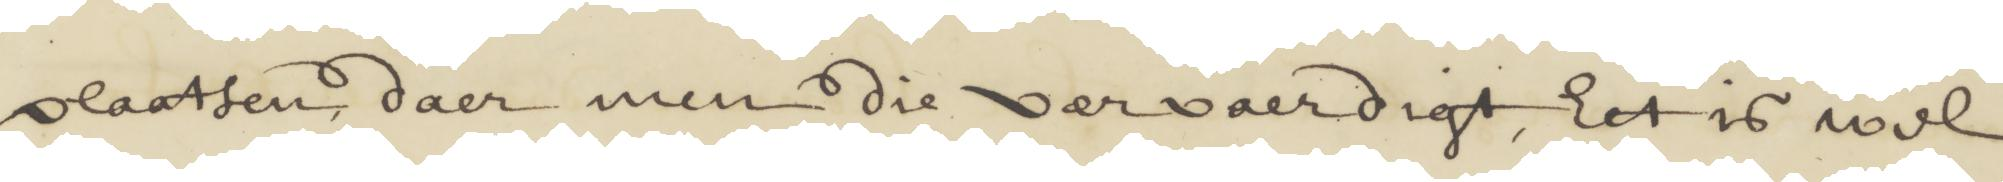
plaatsen, daer men die vervaerdigt, het is wel
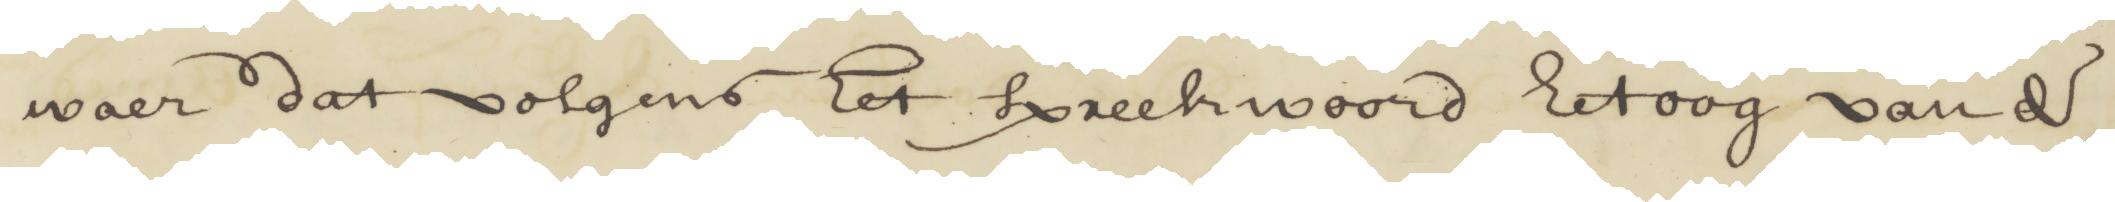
waer dat volgens het spreekwoord het oog van de
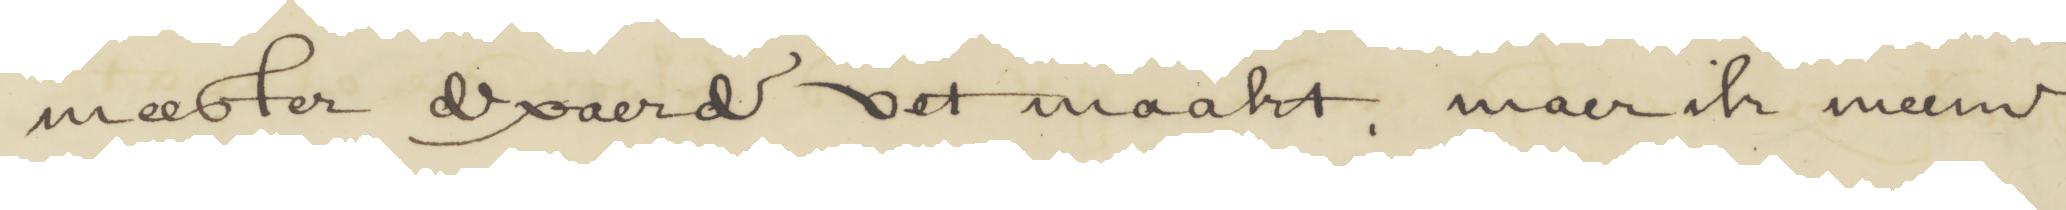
meester de paerde vet maakt, maer ik meene
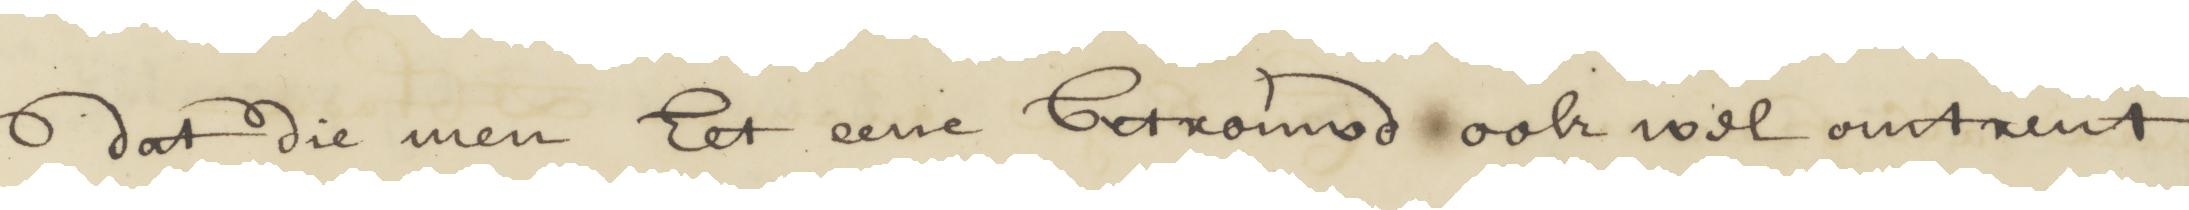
dat die men het eene betrouwd ook wel omtrent
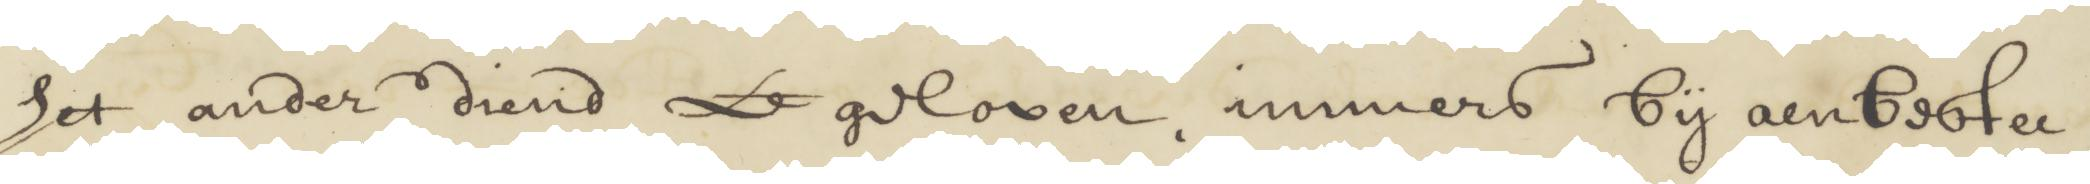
het ander diend te geloven, immers bij aenbestee
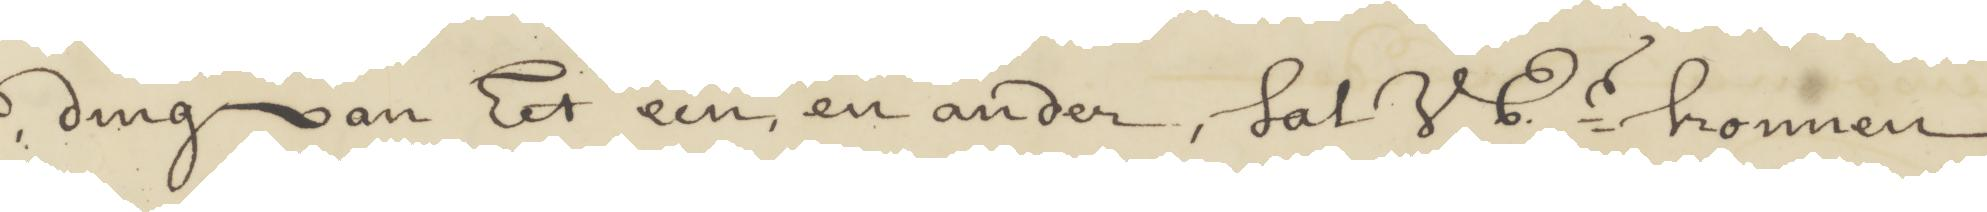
,ding van het een, en ander, tot VE= konnen
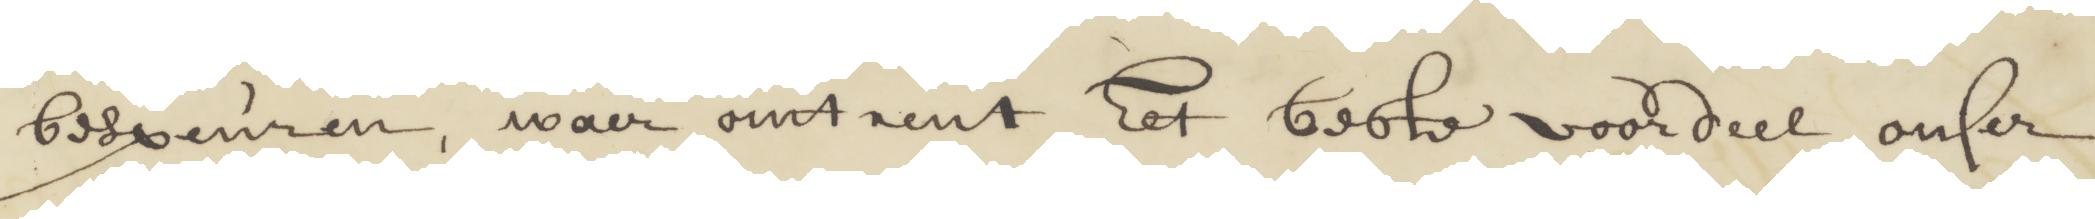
bespeuren, waer omtrent het beste voordeel onser
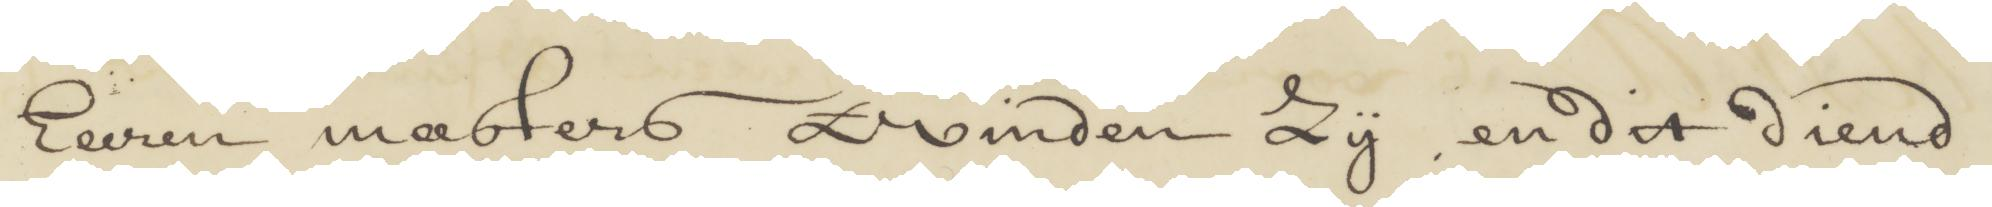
heeren meesters te vinden zij, en dit diend
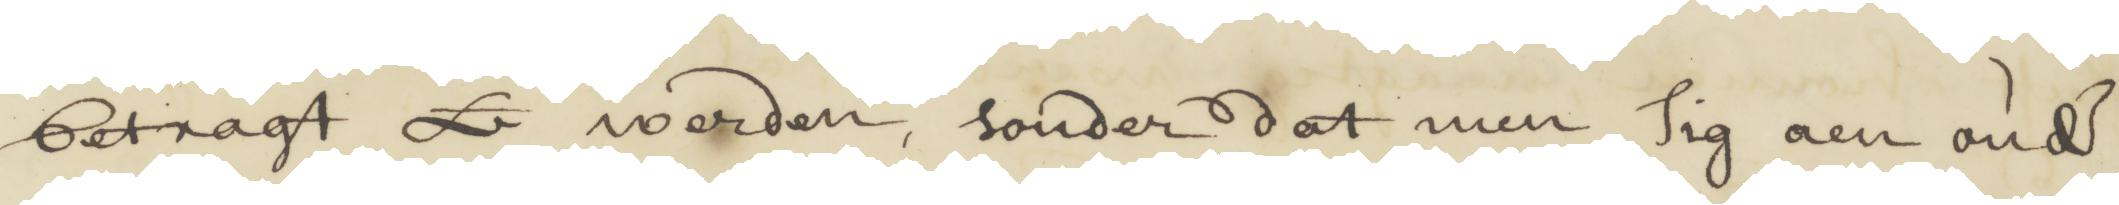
betragt te werden, sonder dat men sig aen oude
